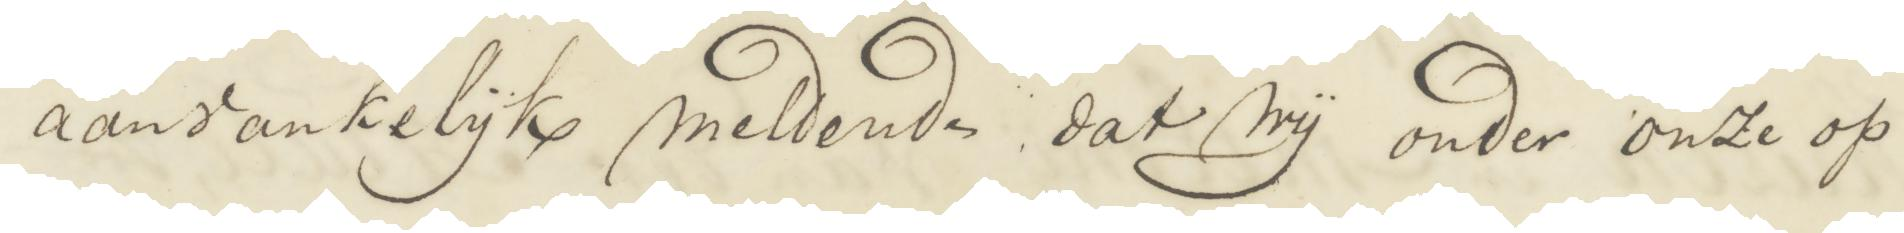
aanvankelijk meldende dat wij onder onze op
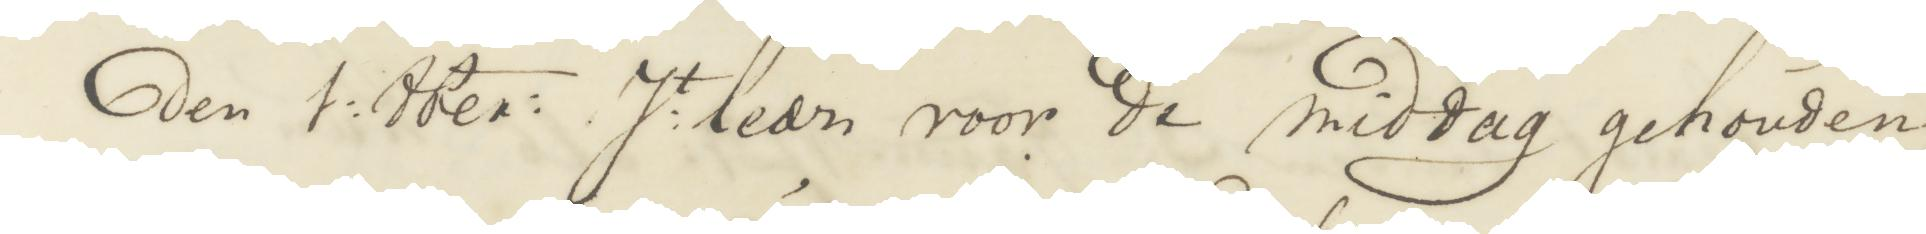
den 1: 8ber: J:t leden voor de middag gehoudene
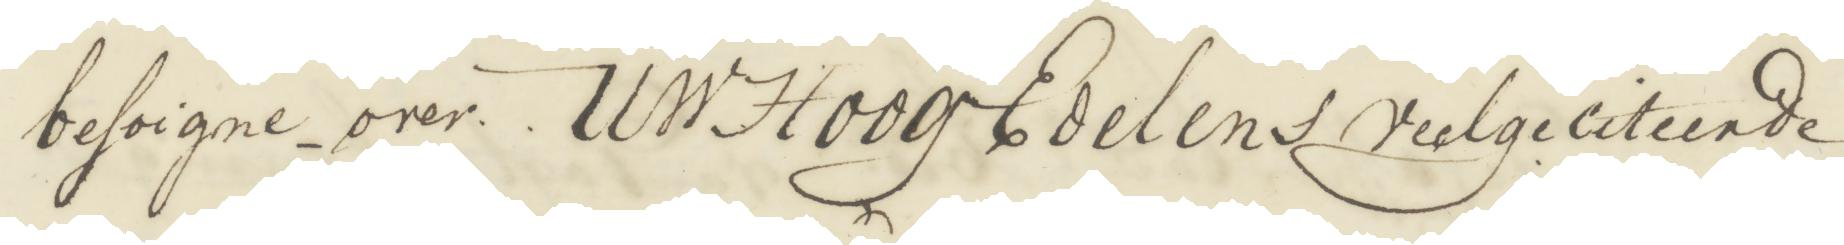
besoigne_over. UW Hoog Edelens veel geciteerde
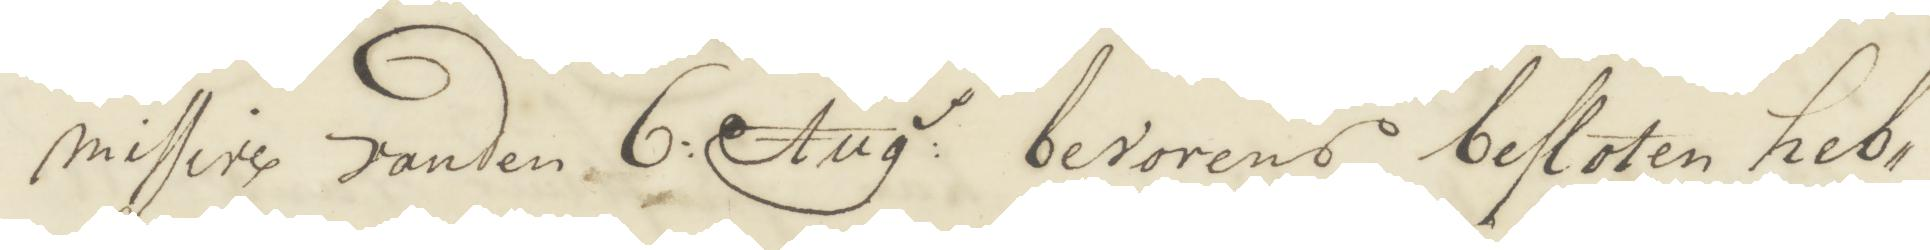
missive van den 6: Aug:s bevorens besloten heb„
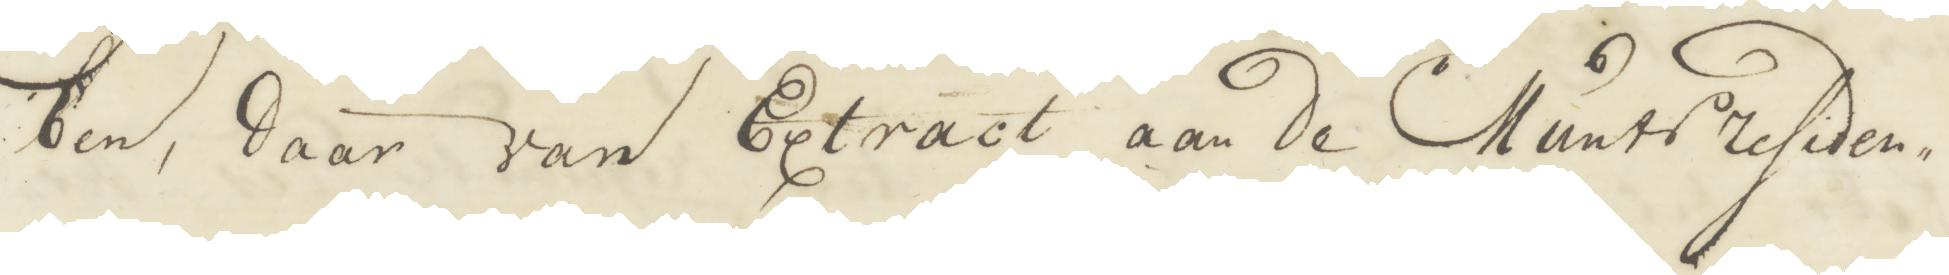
ben, daar van Extract aan de Munts residen„
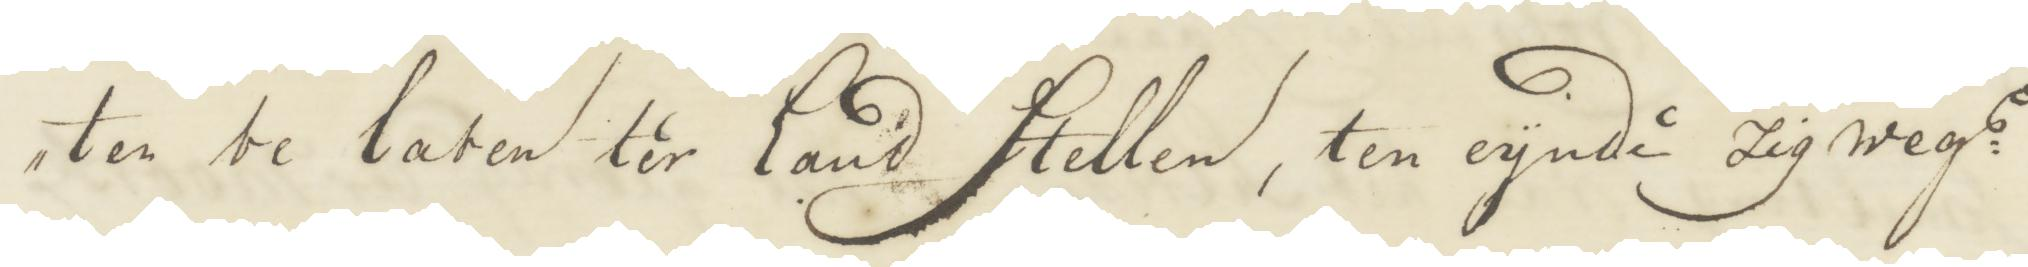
„ten te laten ter hand stellen, ten eijnde zig weg=s
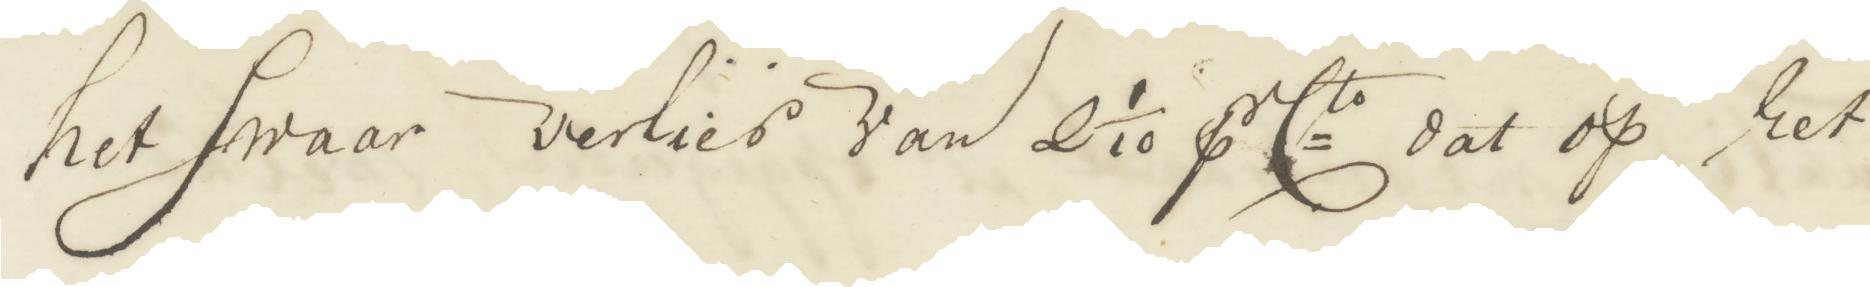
het Swaar verlies van 2 1/10 pr C=to dat op het
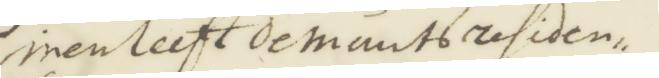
men heeft de munts residen„
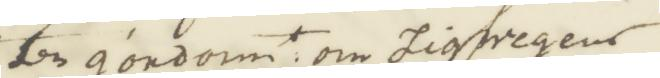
„ten g’ordonn:t om zig wegens
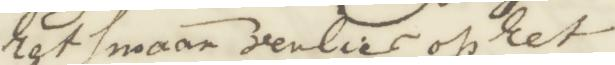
het swaar verlies op het
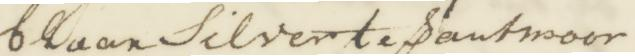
bhaar silver te verantwoor
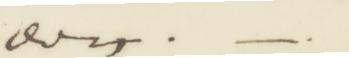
den. —.
